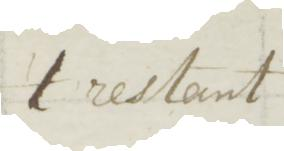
't restant
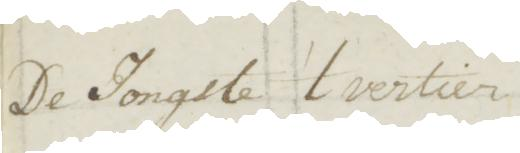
De Jongste 't vertier
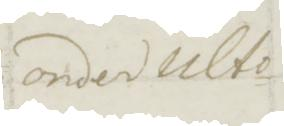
onder ulto
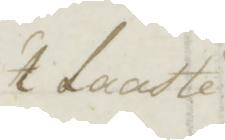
't laaste
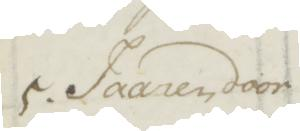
5. Jaaren door
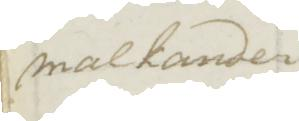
malkander
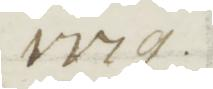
1779.
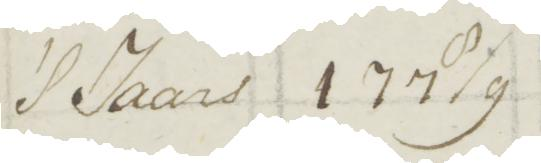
'S Jaars 177 8/9
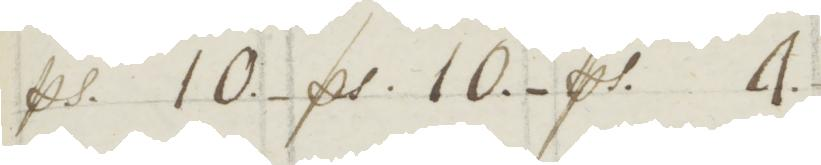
ps. 10._ ps. 10._ ps. 4.
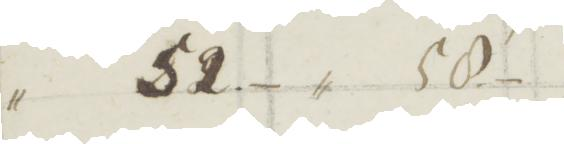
„ 52._ „ 58._
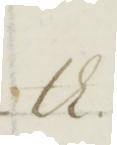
th.
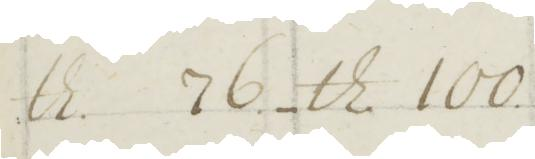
th. 76._ th. 100.
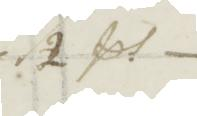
½ p.s
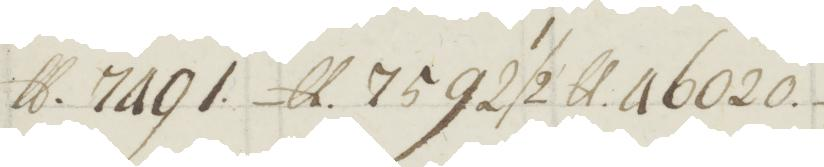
lb. 7491._ lb. 7592½ lb. 46020.
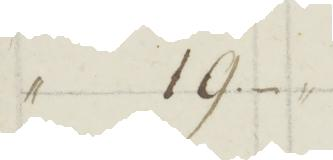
„ 19._„
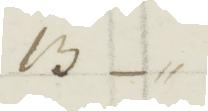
13 _„
